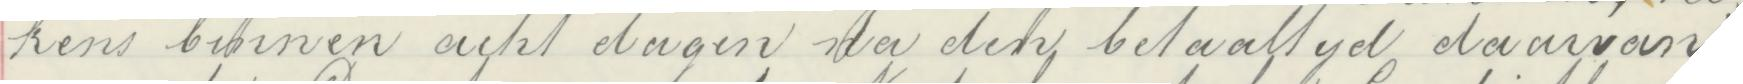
kens binnen acht dagen na den betaaltyd daarvan
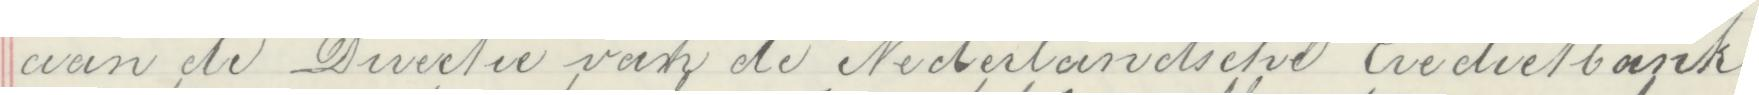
aan de Directie van de Nederlandsche Credietbank
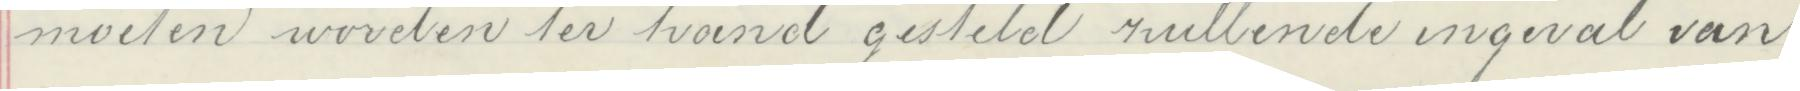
moeten worden ter hand gesteld zullende ingeval van
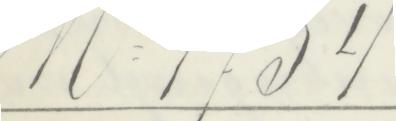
N=o 1734
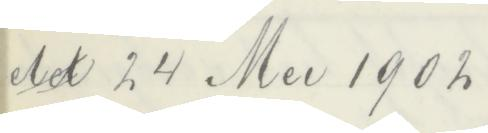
dd 24 Mei 1902
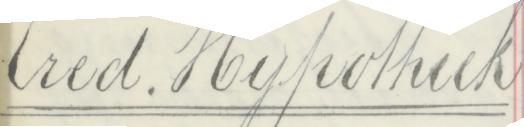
Cred. Hypotheek
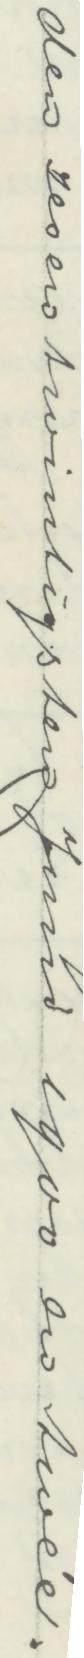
den zes en twintigsten Juni 1900 en twee.
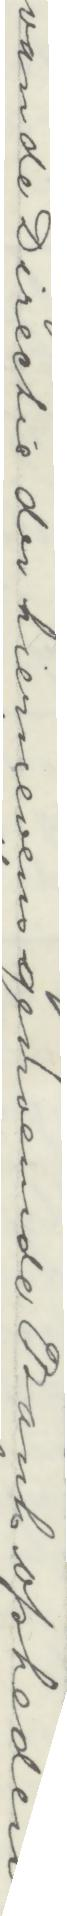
van de Directie der hiernevens genoemde Bank opheden
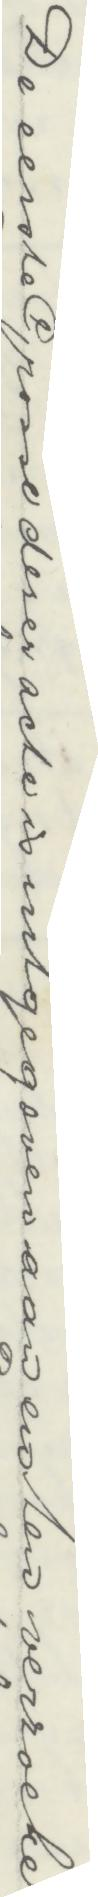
De eerste Grosse dezer acte is uitgegeven aan en ten verzoeke
